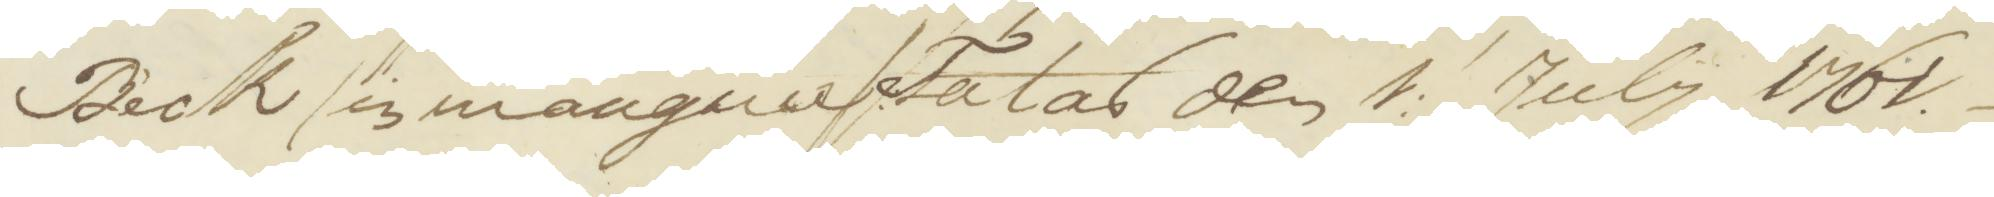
Beck /in margine/ Tatas den 1:' Julij 1761.
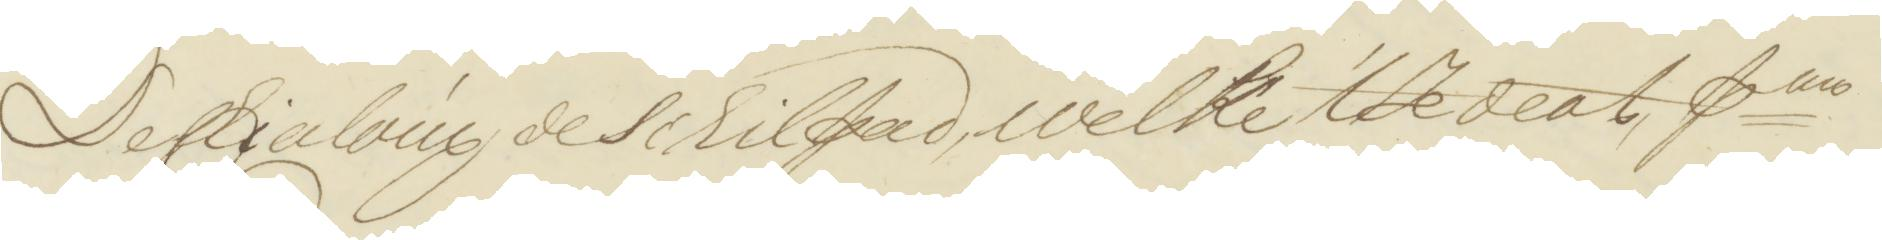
De Chialoup de schilpad, welke 't zedert p=mo
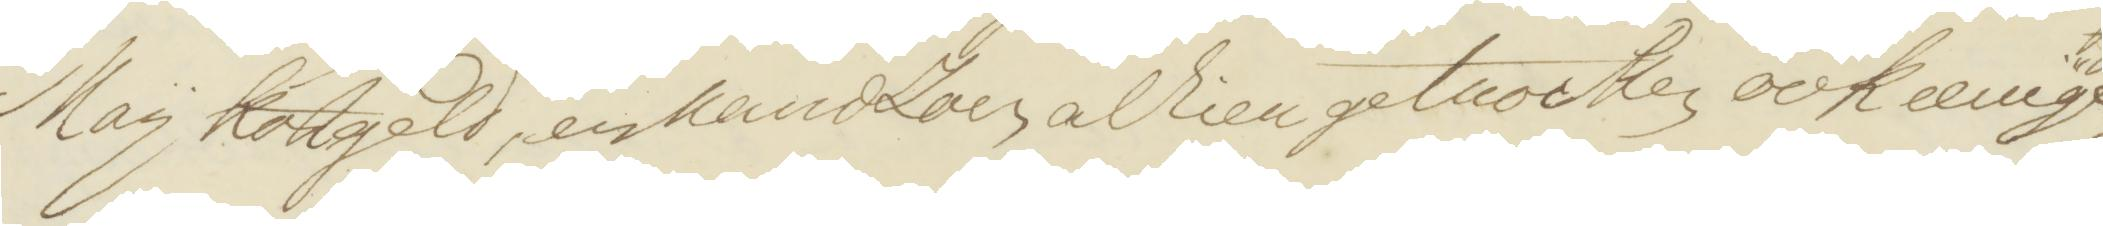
Maij kostgeld, en randzoen alhier getrocken ook eenige
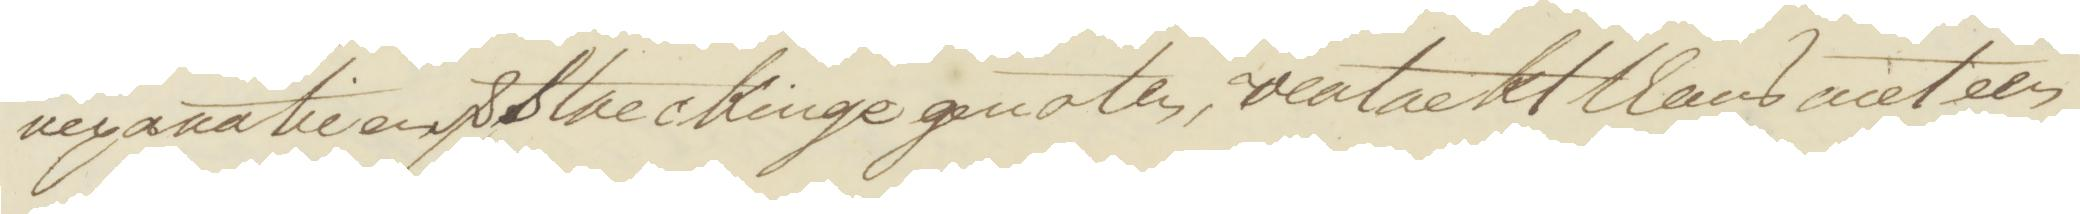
reparatie en verstreckinge genoten, vertrekt thans met een
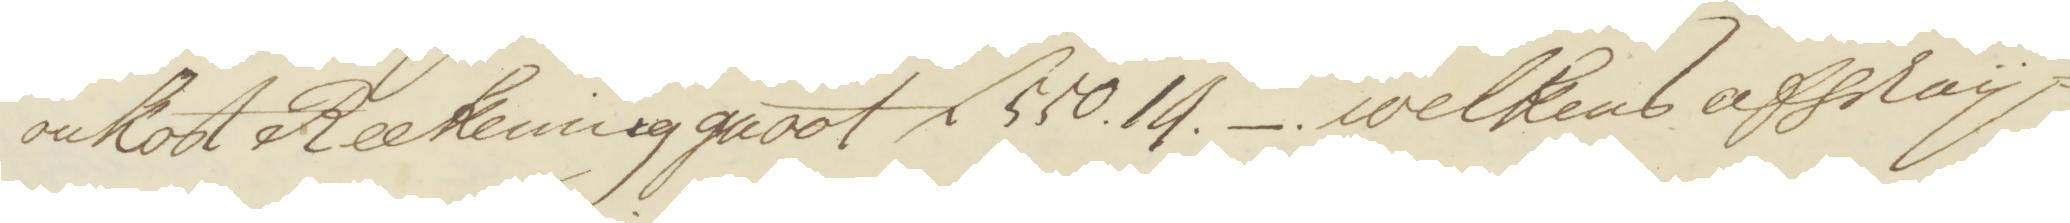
onkost Reekening groot ƒ550.14 . — . welkers afschrij
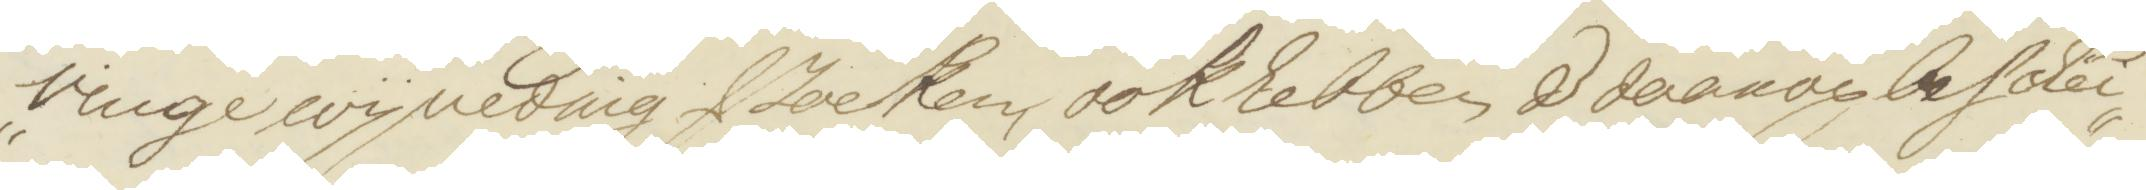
vinge wij nedrig verzoeken, ook hebben de daarop beschei„
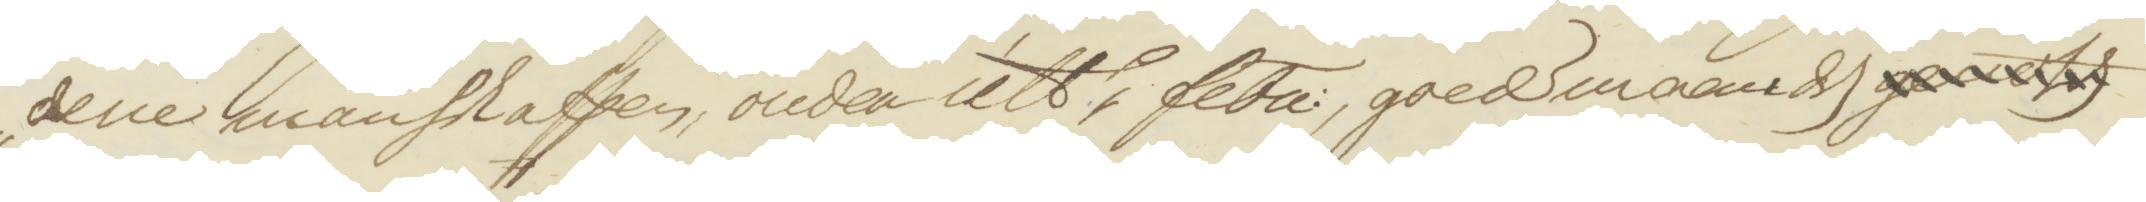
dene manschappen, onder ult„o febr:, goede maanden genoten
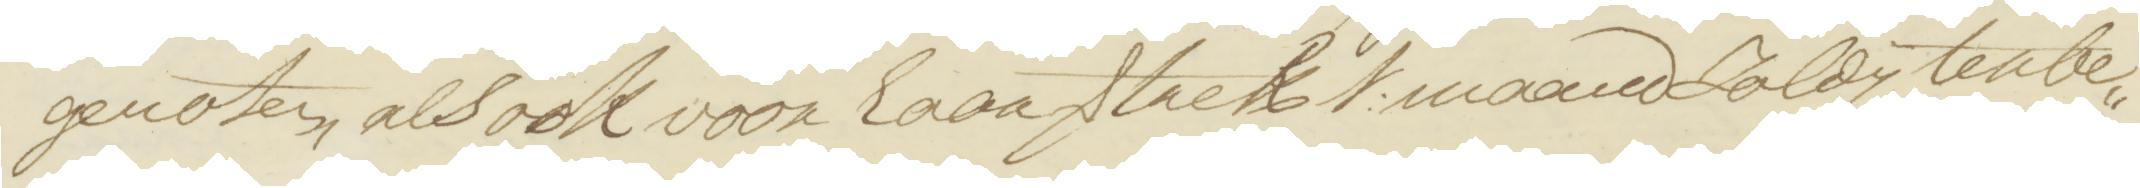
genoten, als ook voor haar vertrek 1: maand zoldij ter be„
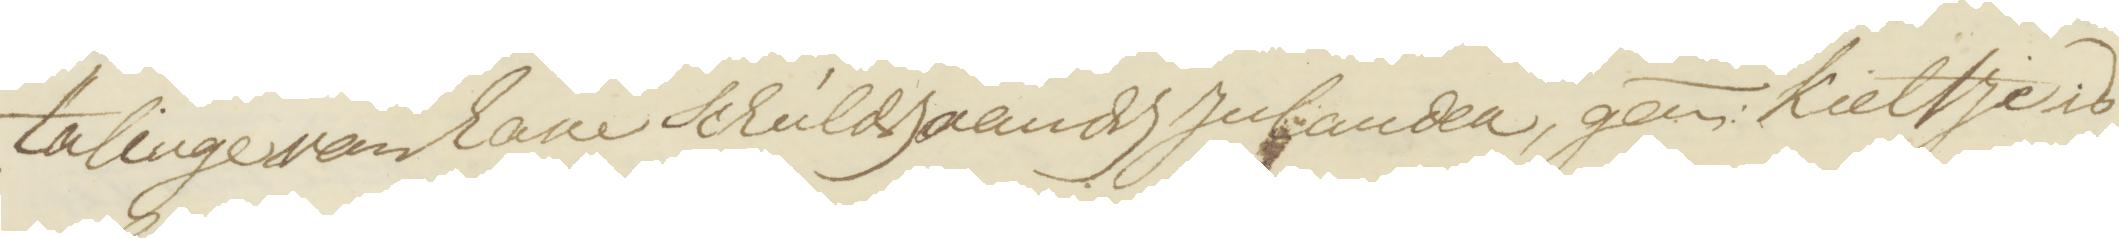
talinge van hare schulden aan den jnlander, gem: kieltje is
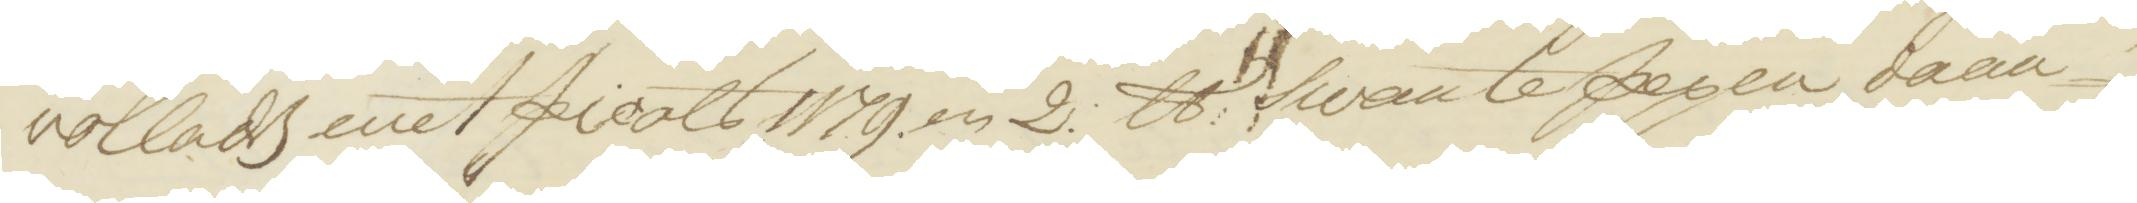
volladen met picols 1179. en 2. lb: swarte peper daar
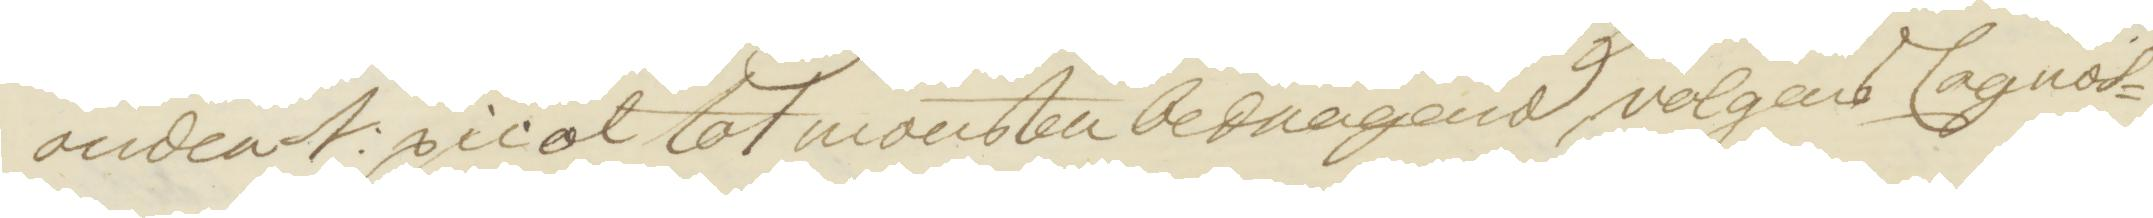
onder 1: picol tot monster bedragende, volgens Cognos=
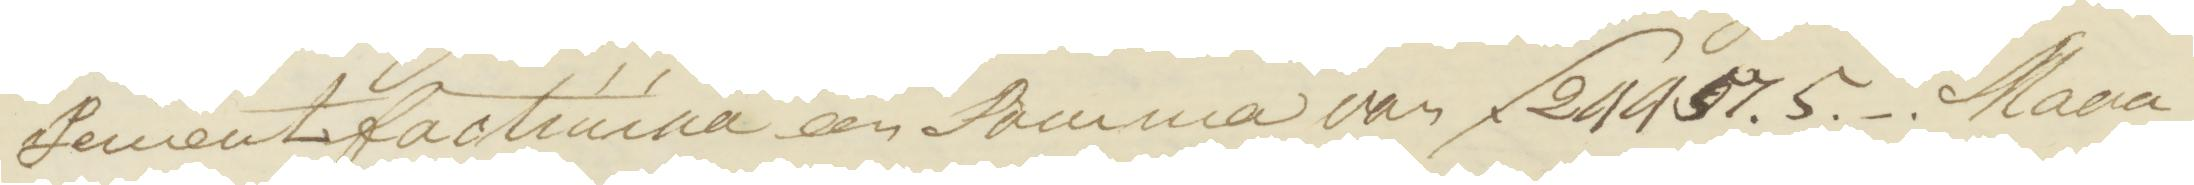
sement factuura een somma van ƒ24457. 5. — . Maar
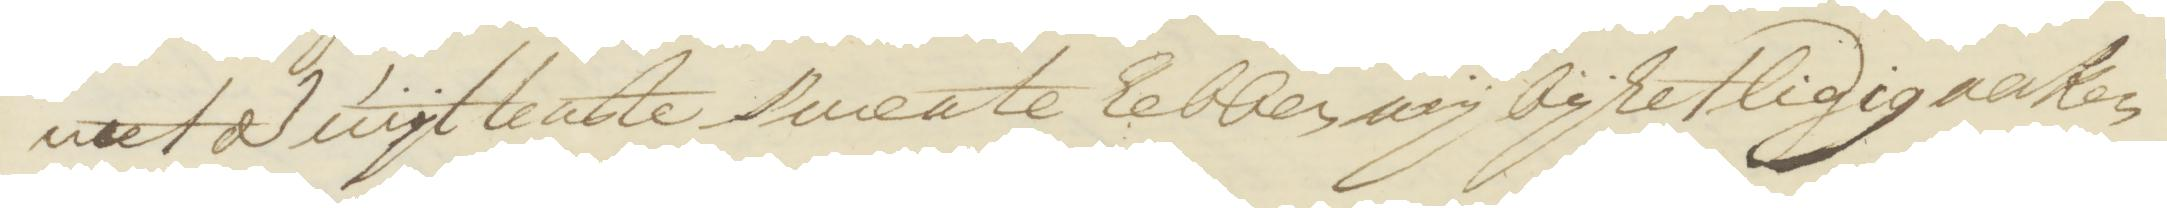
met de uijtterste smerte hebben wij bij het lidigraken
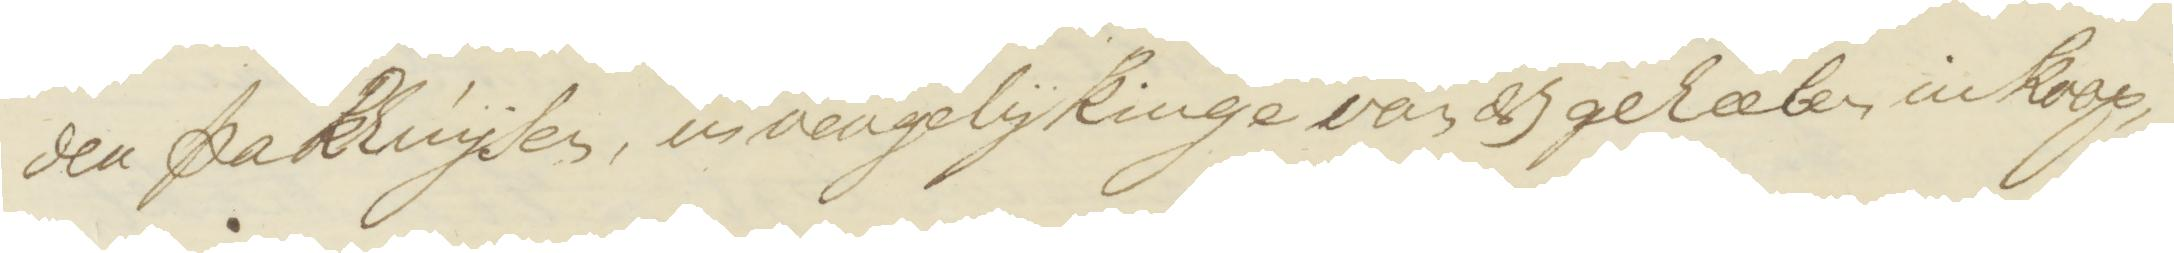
der pakhuijsen, in vergelijkinge van den geheelen inkoop,
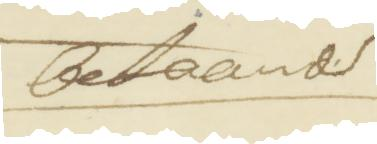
bestaande
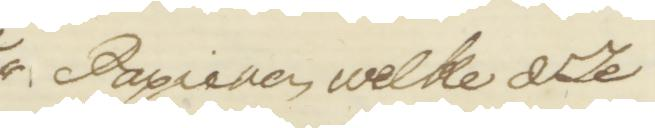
Papieren welke deze
